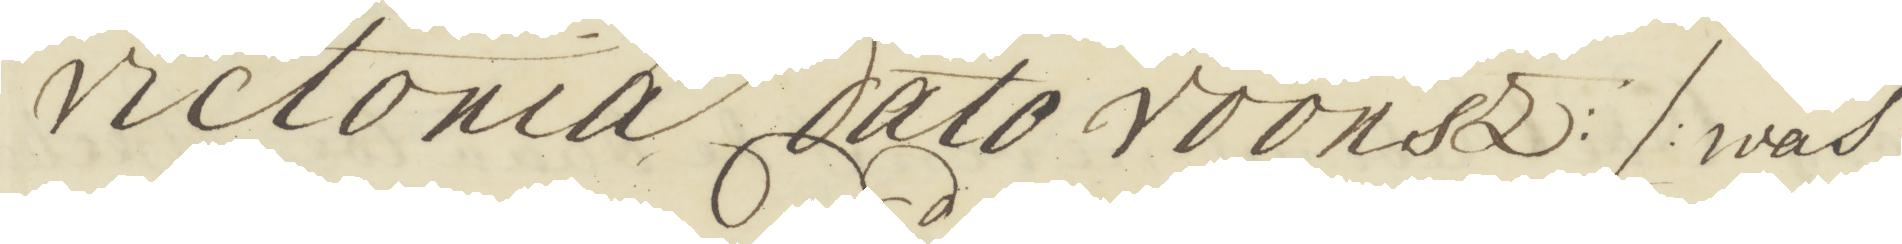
victoria dato voorsz: /:was
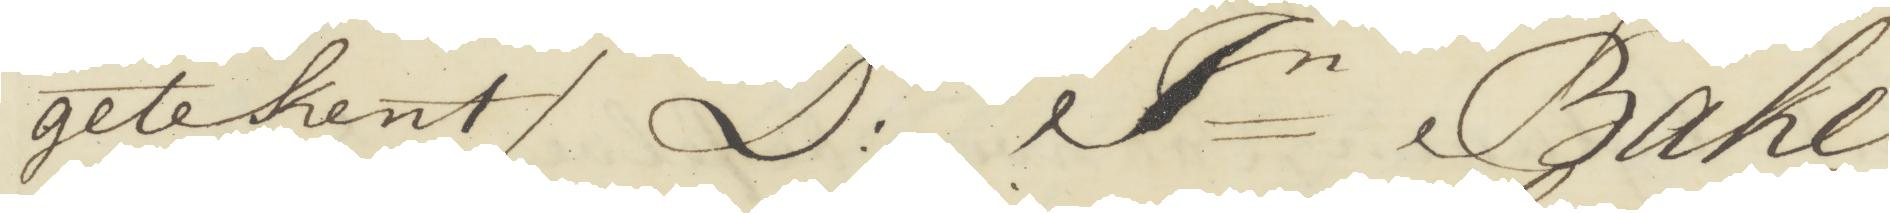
getekent/ D:d J=n Bake,
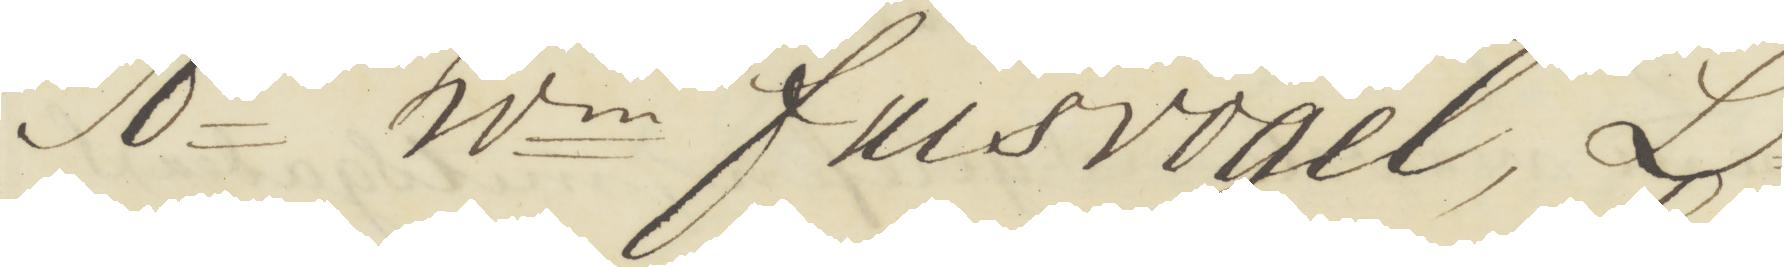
H=n W=m frisvogel, L=s
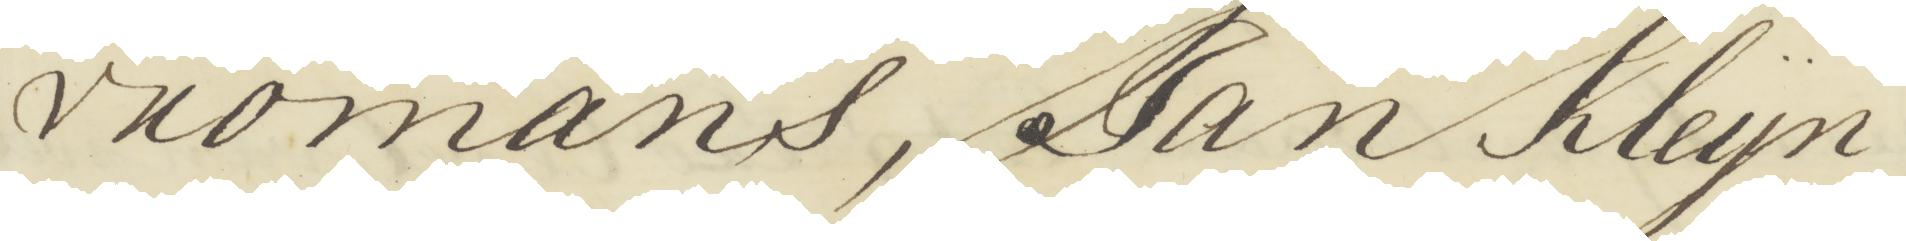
vromans, Jan kleijn
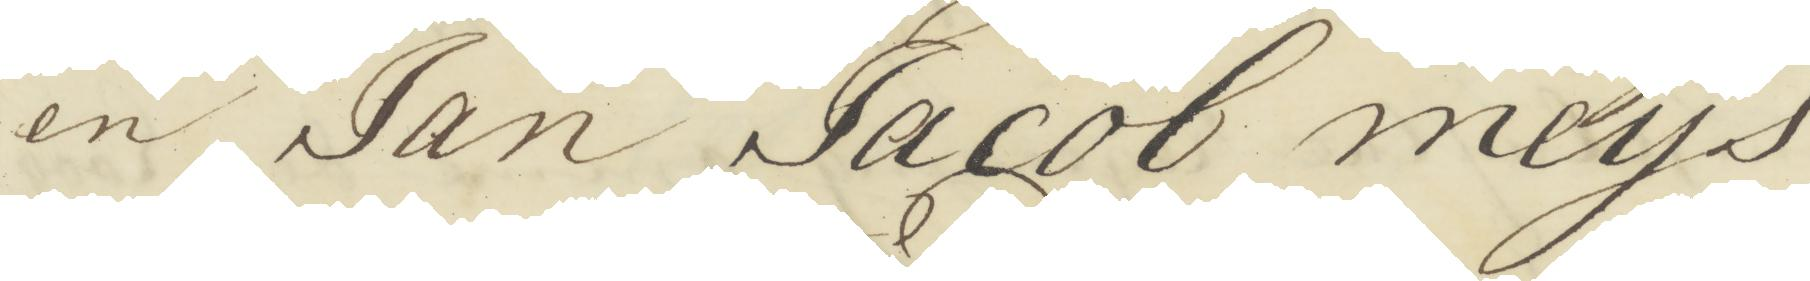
en Jan Jacob meijs
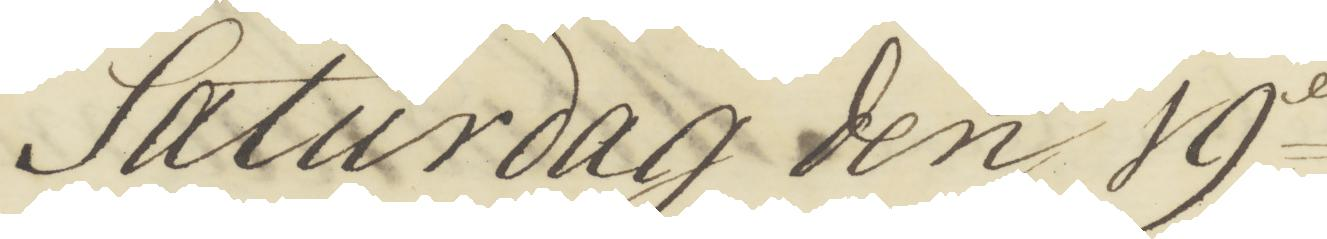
Saturdag den 19=en
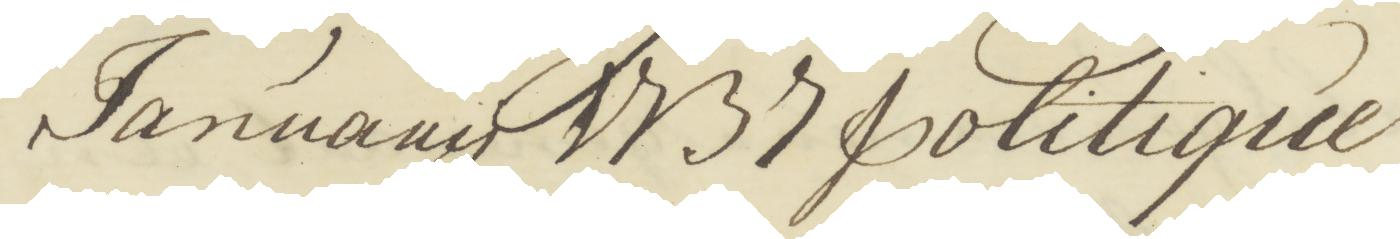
Januarij 1737 politique
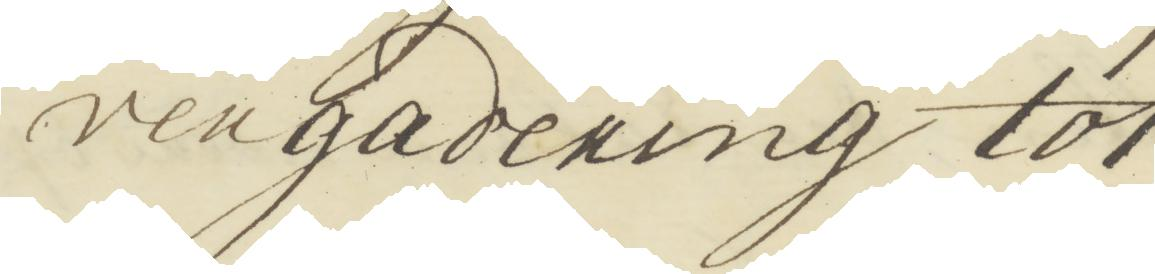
vergadering tot
